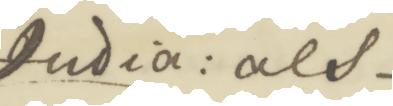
India: als
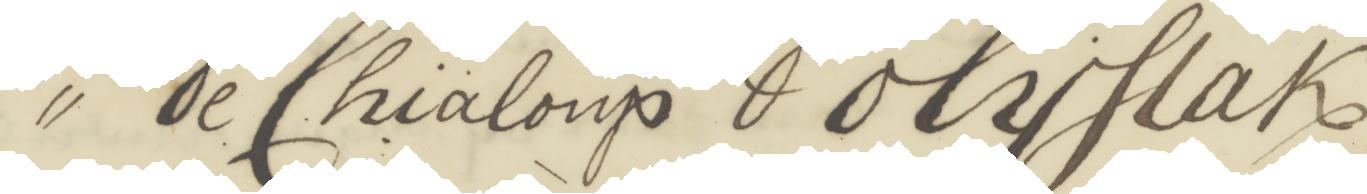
de Chialoup d'olijftak
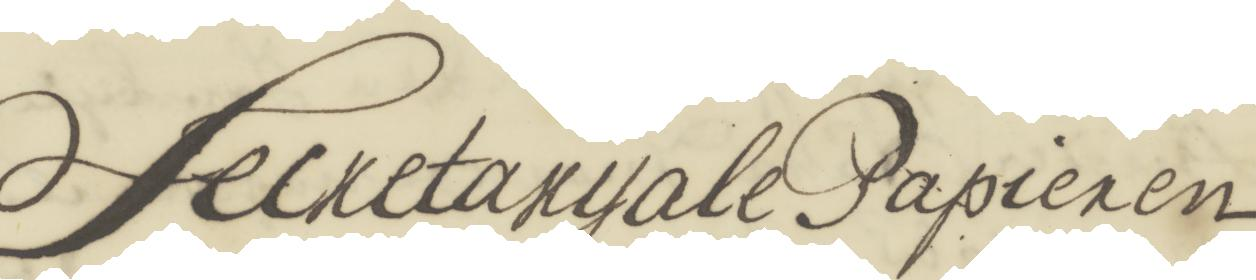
Secretarijale Papieren
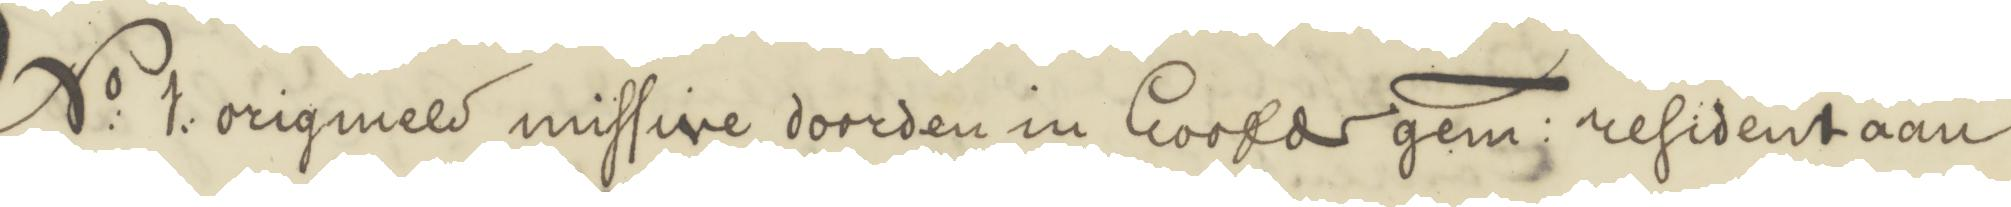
N:o 1: originele missive doorden in hoofde gem: resident aan
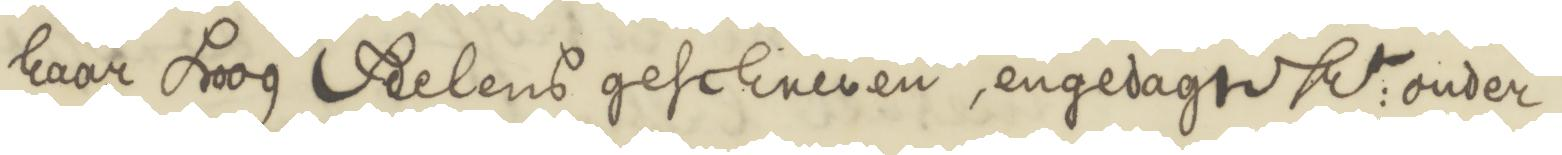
haar hoog Edelens geschreven, engedagtek:t onder
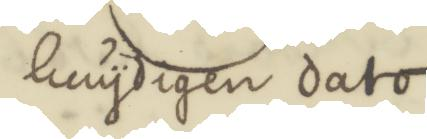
huijdigen dato
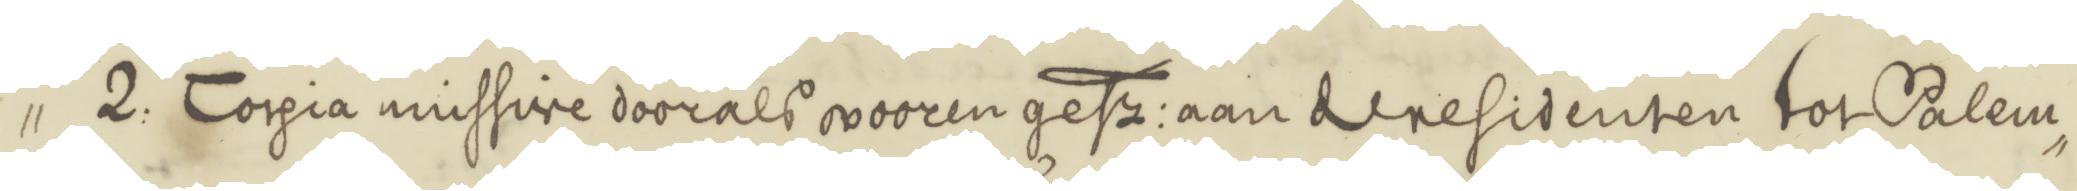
„ 2: Copia missive doorals vooren gesz: aan de residenten tot Palem„
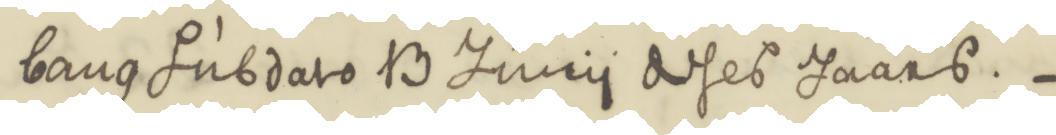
bang subdato 13 Junij deses Jaars.
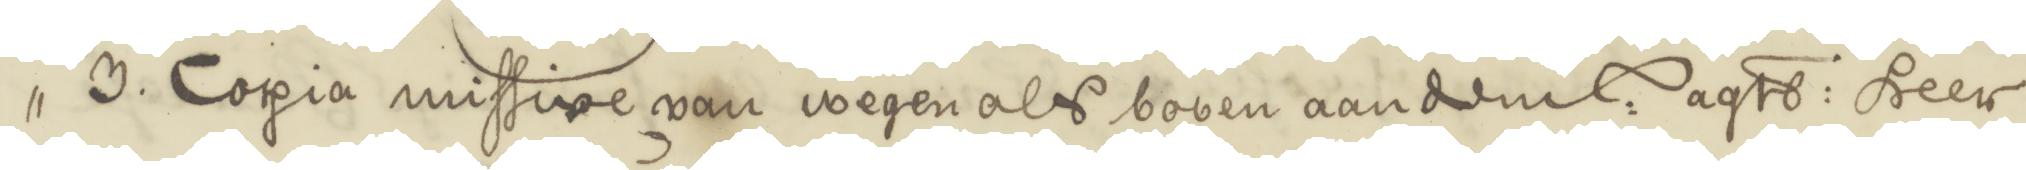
„ 3: Copia missive van wegen als boven aanden E: agtb: Heer
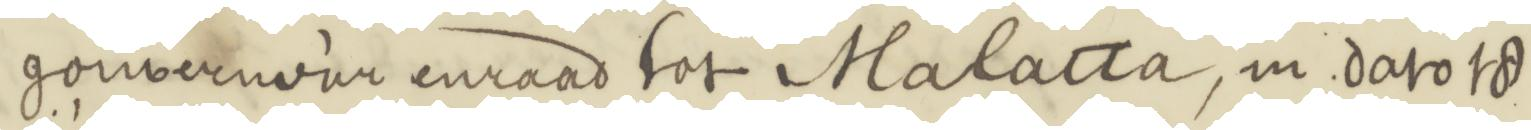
gouverneur en raad tot Malacca, in dato 18
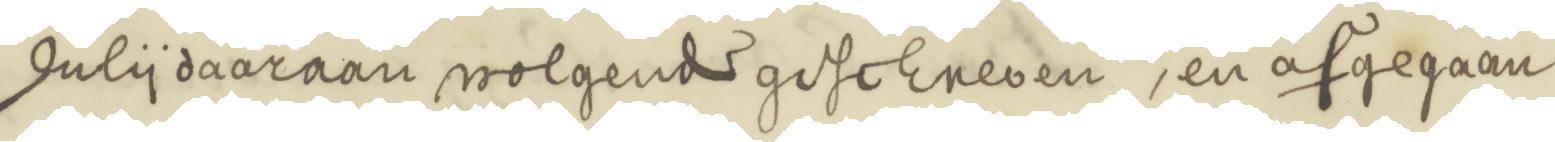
julij daaraan volgende geschreven, en afgegaan
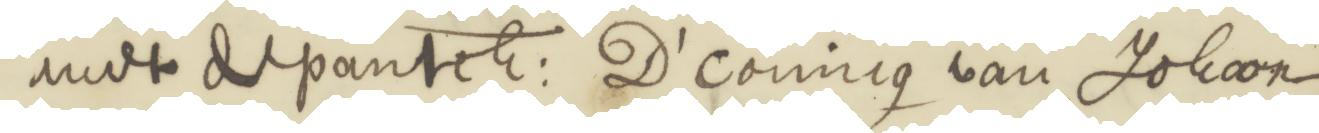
met depantch: D’ Coning van Johoor
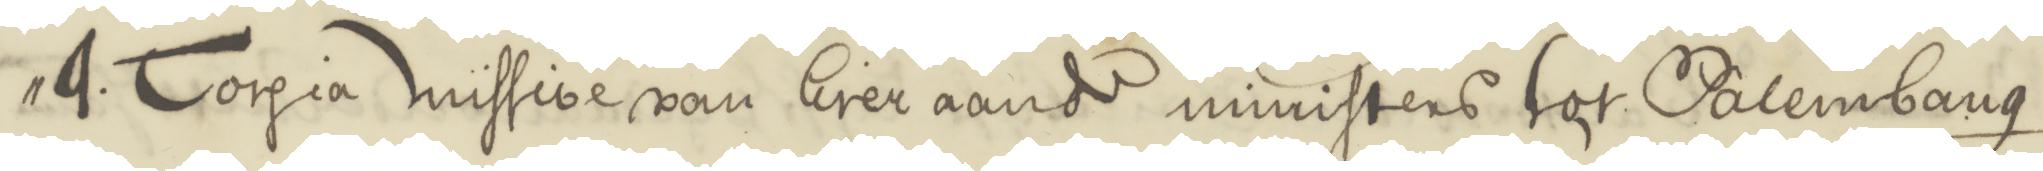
„4: Copia missive van hier aande ministers tot Palembang
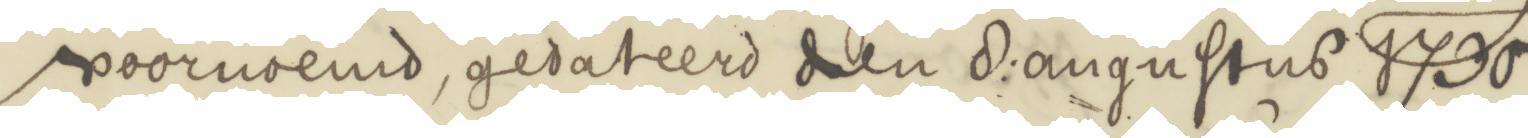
voornoemd, gedateerd den 8: augustus 1730
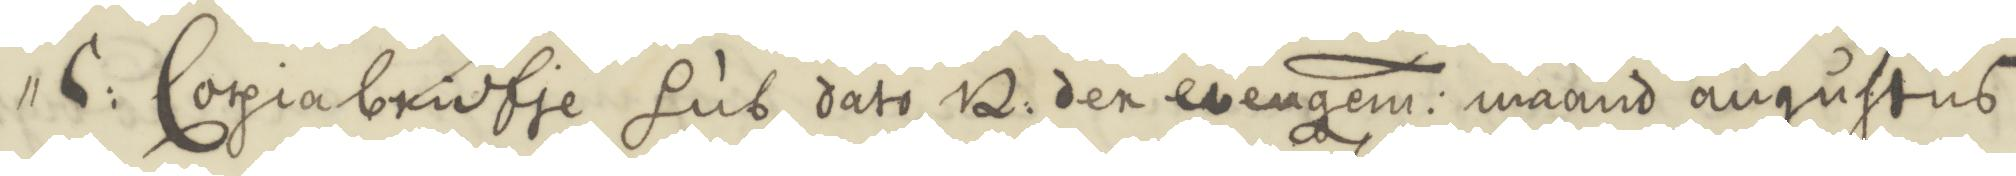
„6: Copia briefje sub dato 12: der evengem: maand augustus
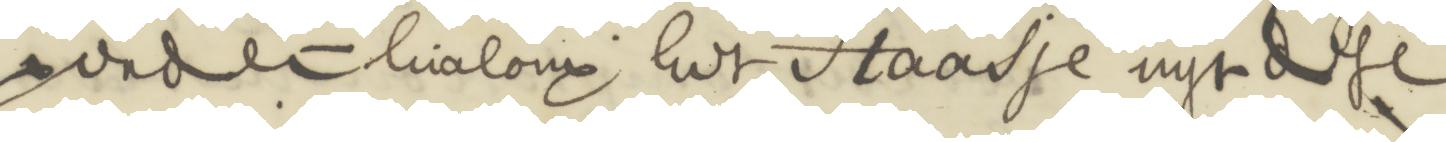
perde chialoup het Haasje uijt dese
